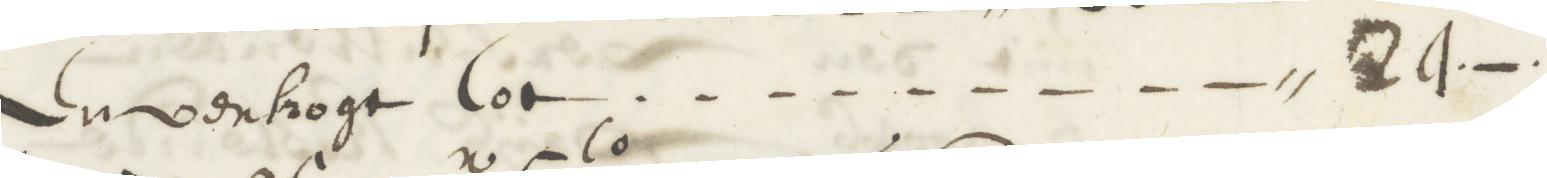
En verkogt tot . . - - - - - - - „24 .-.
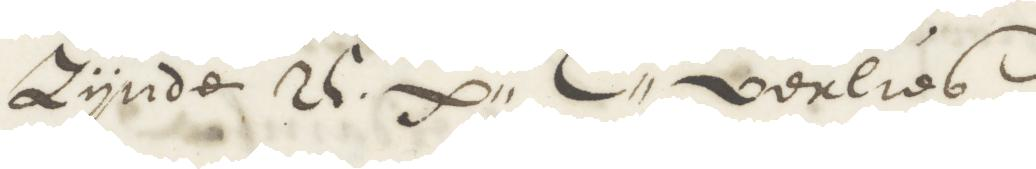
Zijnde 25. p„r C„to verlies
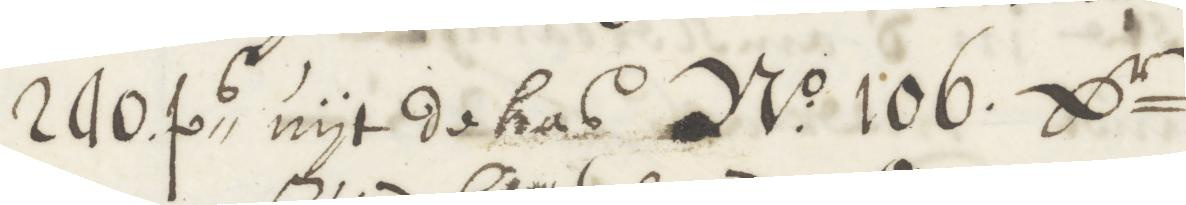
240. p„s uijt de has N:o 106. p„r
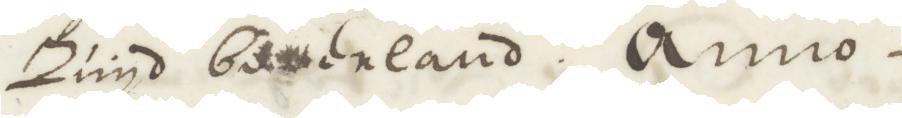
Zuijd beverland Anno
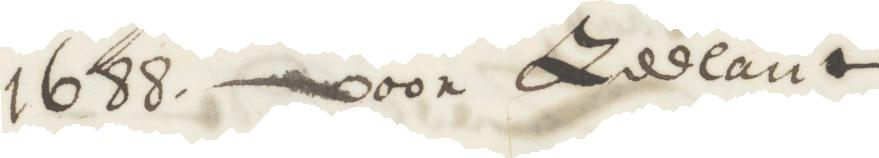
1688. voor Zeelant
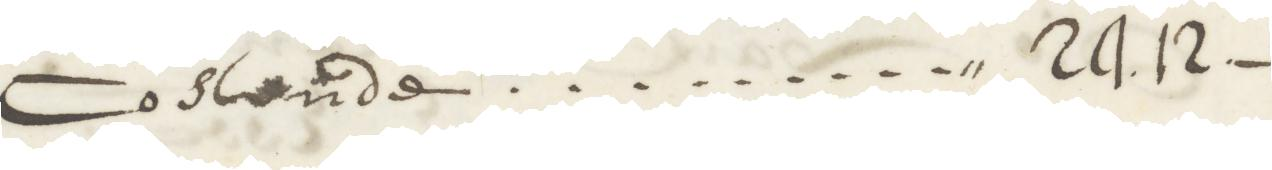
Costende . . . . . . . . . „ 24.12 .-
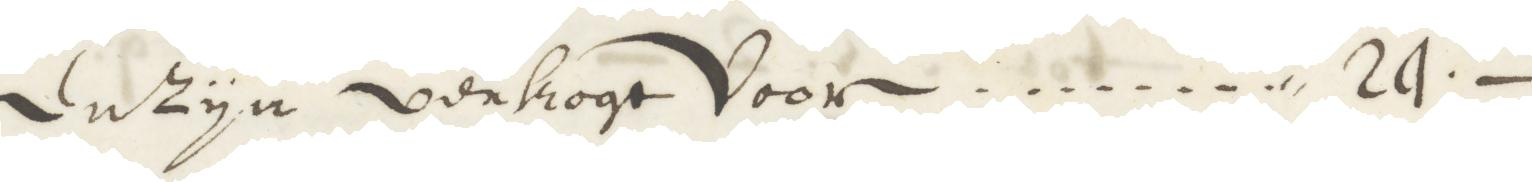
En zijn verkogt Voor . . . . . . . „24 .-
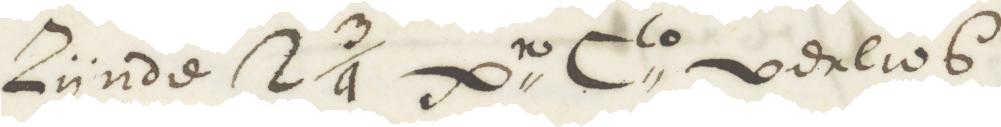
zijnde 2¾ p„r c„to verlies
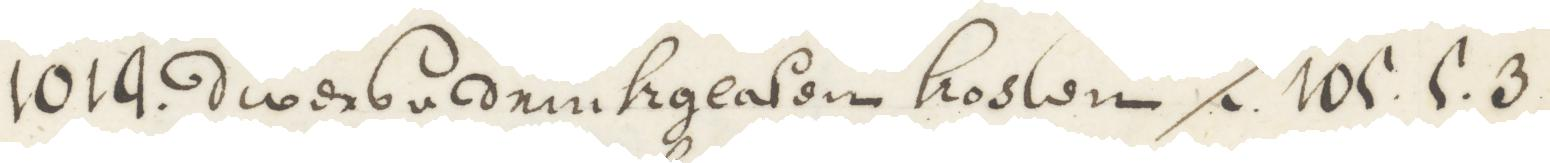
1014. diverse drink glasen kosten ƒ. 105.5.3
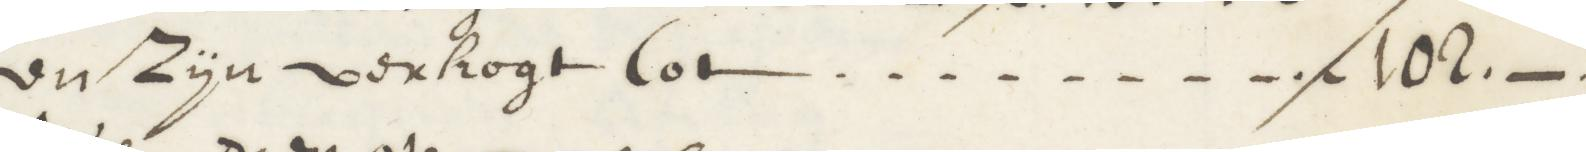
en zijn verkogt tot . . . . . - - ƒ 102.-.
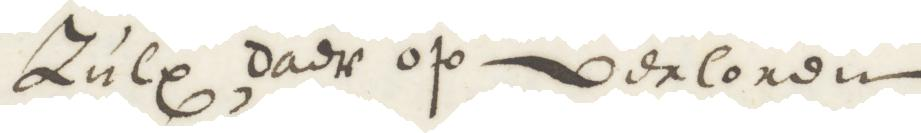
zulx daer op verloren
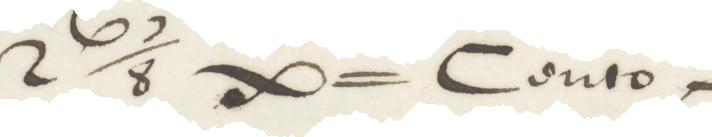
2 2/8 p=r Cento
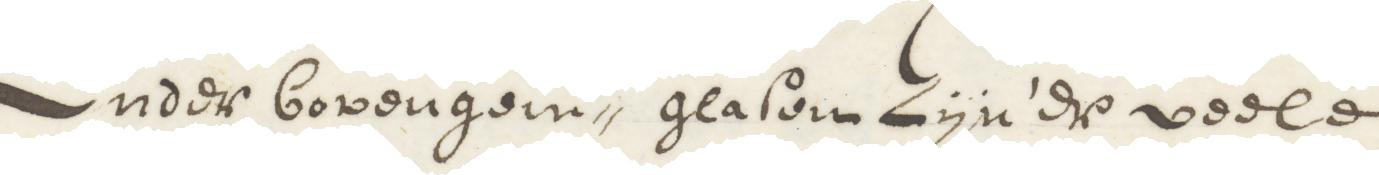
Ender bovengem„te glasen zijn ’er veele
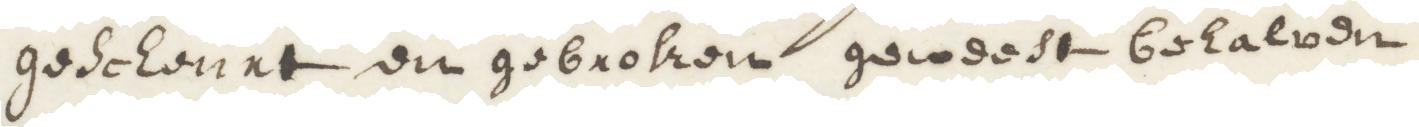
gescheurt en gebroken geweest behalven
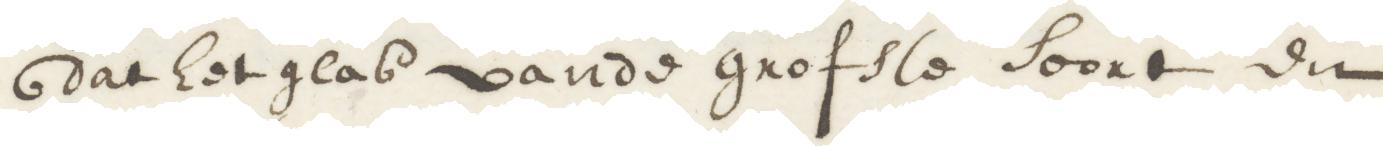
dat het glas vande grofste soor't en
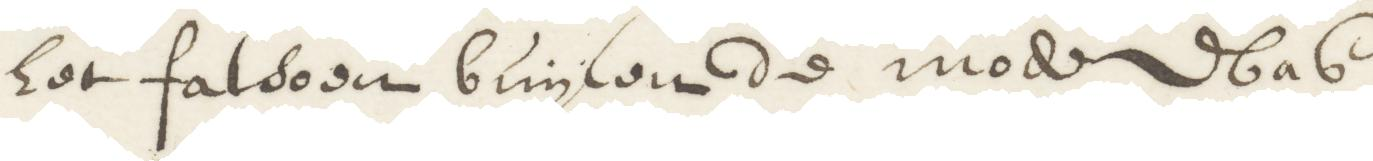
het fatsoen buijten de mode Was
